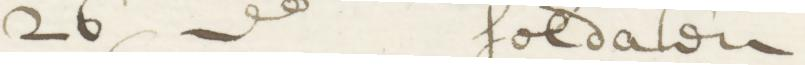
26 do soldaten
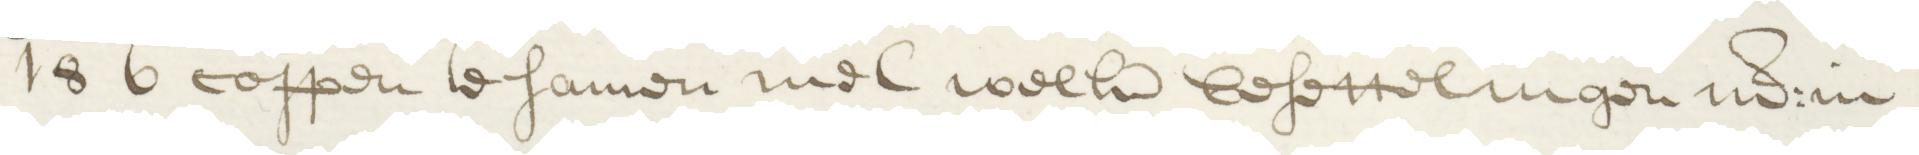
186 coppen te samen met welke besettelingen uE: in
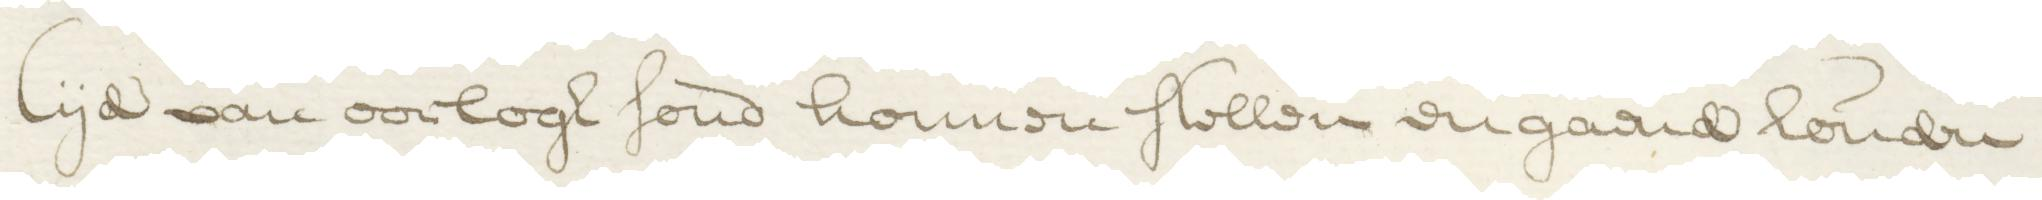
tijde van oorlogh soud konnen stellen en gaende houden
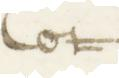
ot
